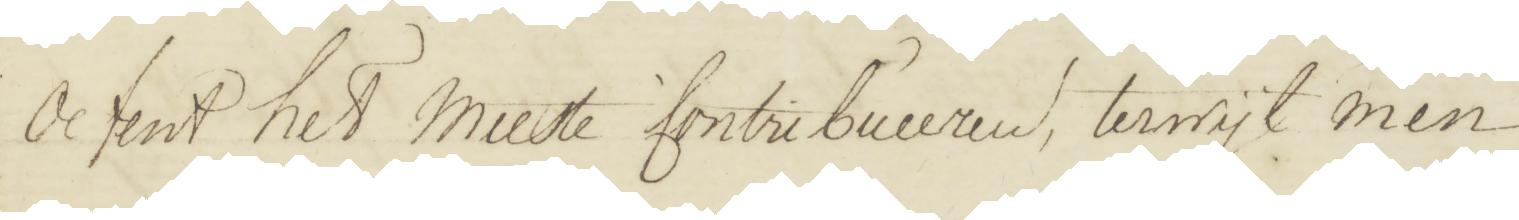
oefent het meeste contribueeren, terwijl men
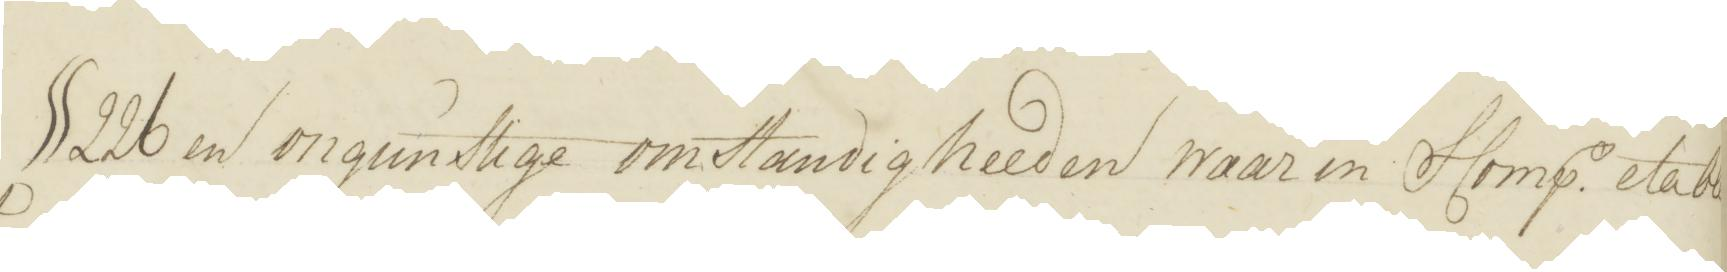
§ 226 en ongunstige omstandigheeden waar in 'sComp.s etab
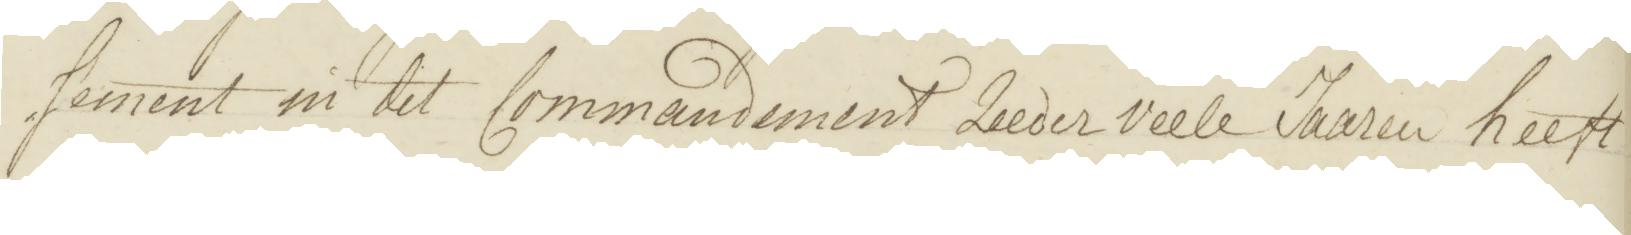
„sement in dit Commandement zeeder veele Iaaren heeft
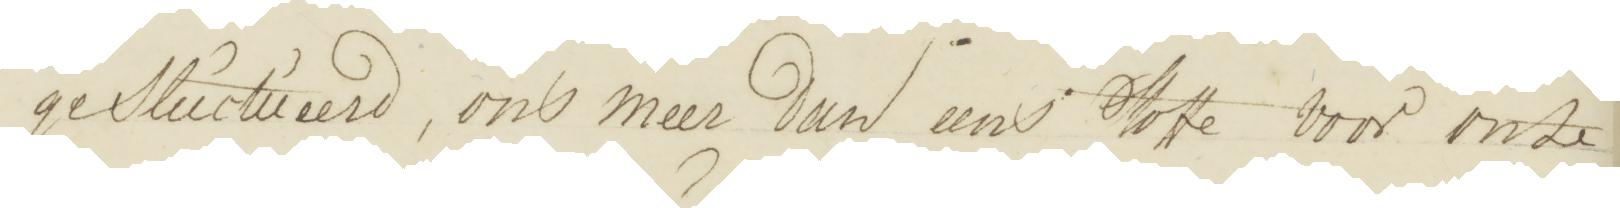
gesluctueerd, ons meer dan eens stoffe voor onze
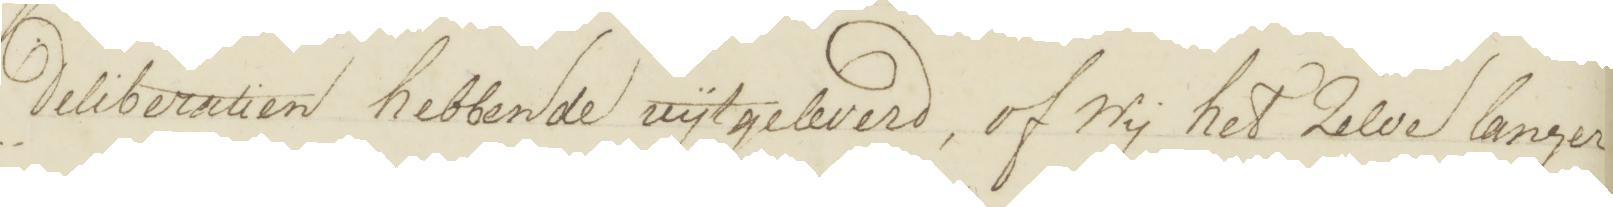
deliberatien hebbende uijtgeleverd, of wij het zelve langer
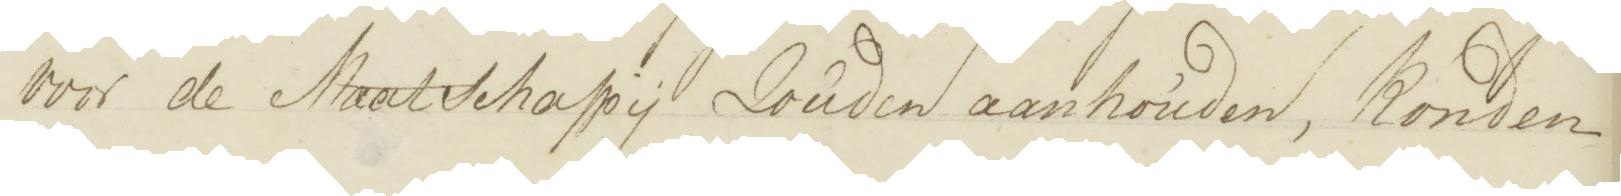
voor de Maatschappij zouden aanhouden, konden
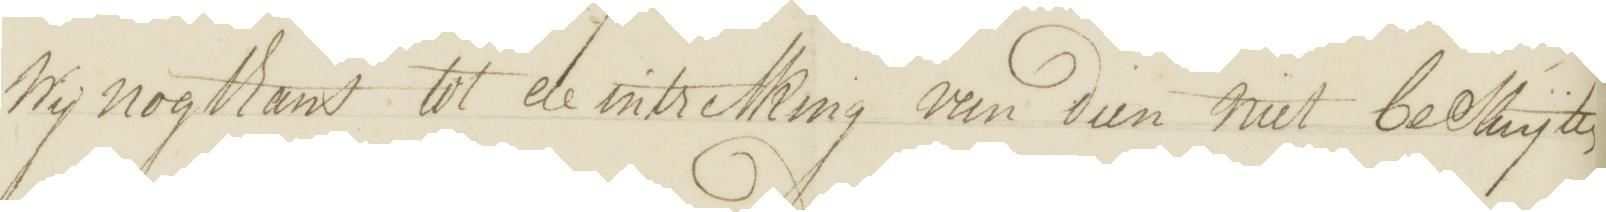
wij nogthans tot de intrekking van dien niet besluijten
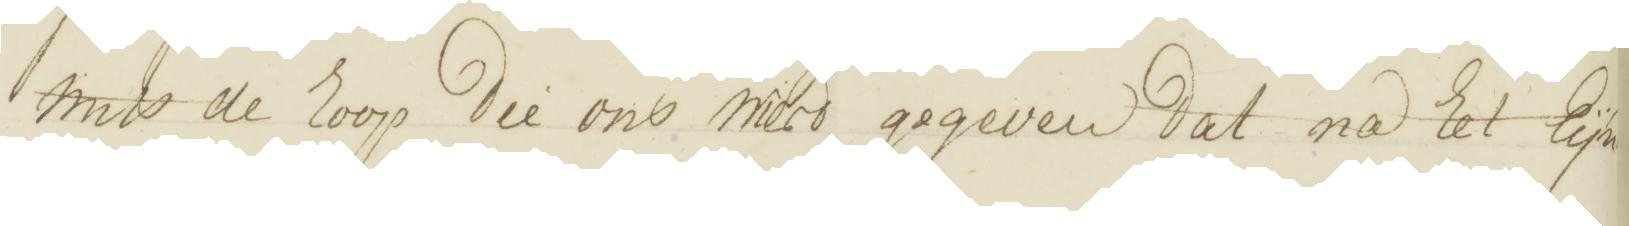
mits de hoop die ons wierd gegeven dat na het Eijn
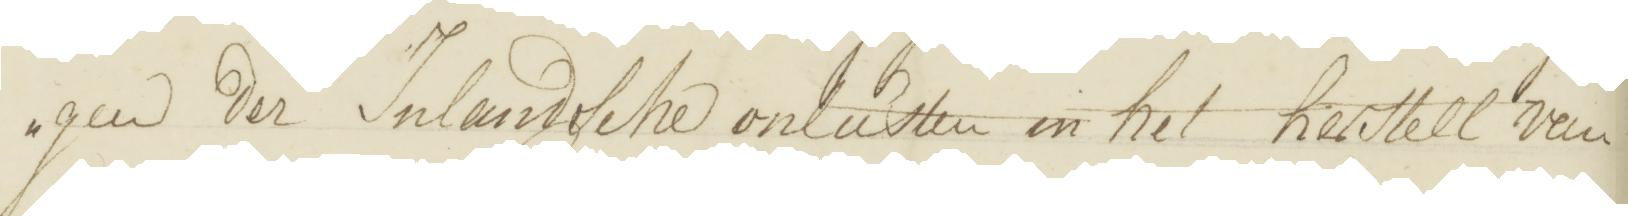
„gen der Inlandsche onlusten in het herstell van
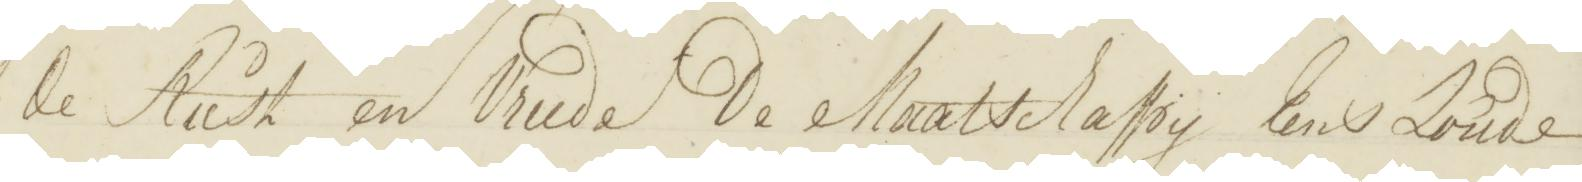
de Rust en Vreede de Maatschappij Eens zoude
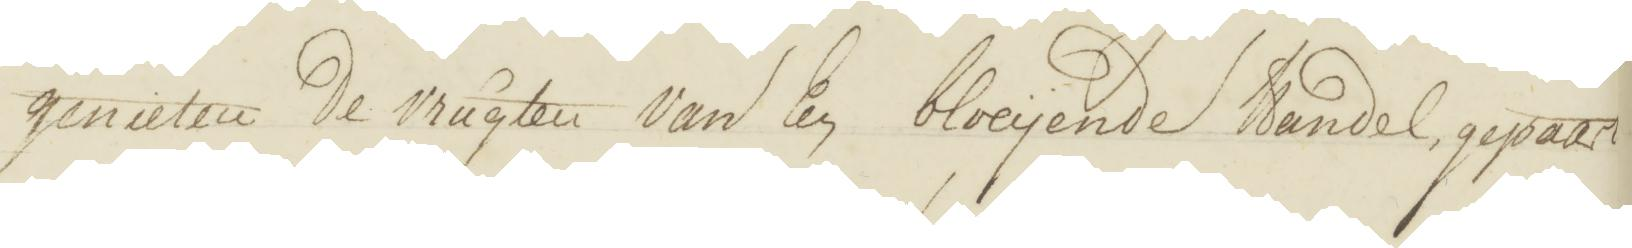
genieten de vrugten van Een bloeijende Handel, gepaart
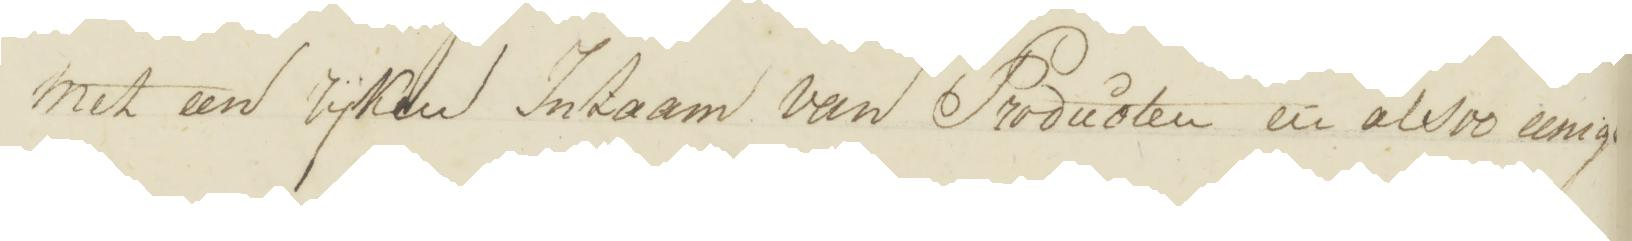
met een rijken Inzaam van Producten en alsoo eenige
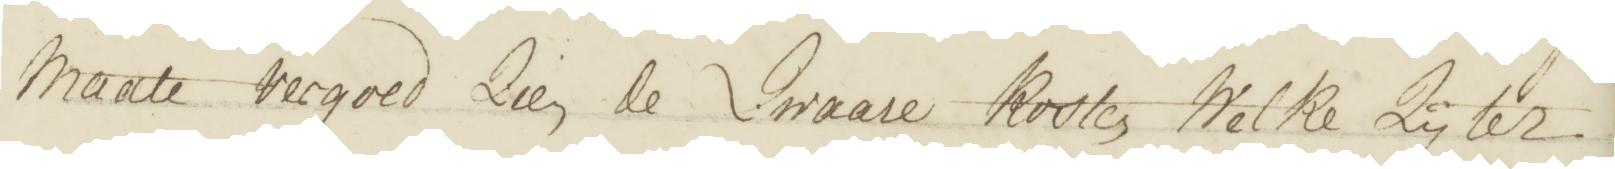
maate vergoed zien de zwaare kosten welke zij ter
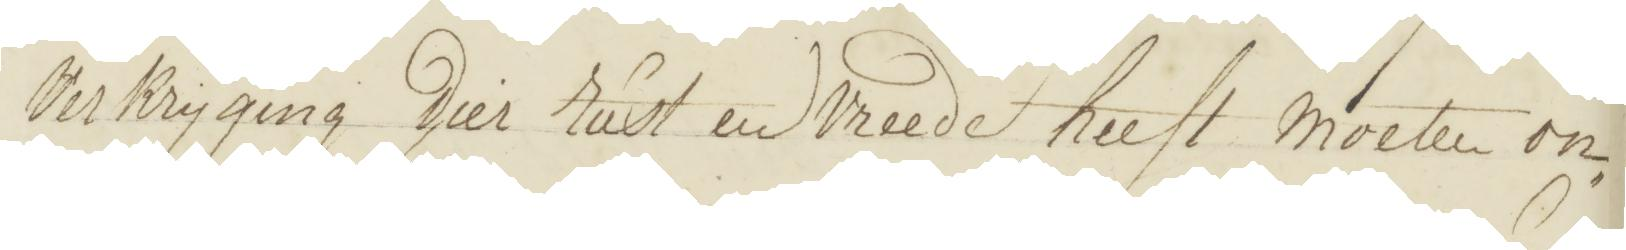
verkrijging dier rust en vreede heeft moeten on
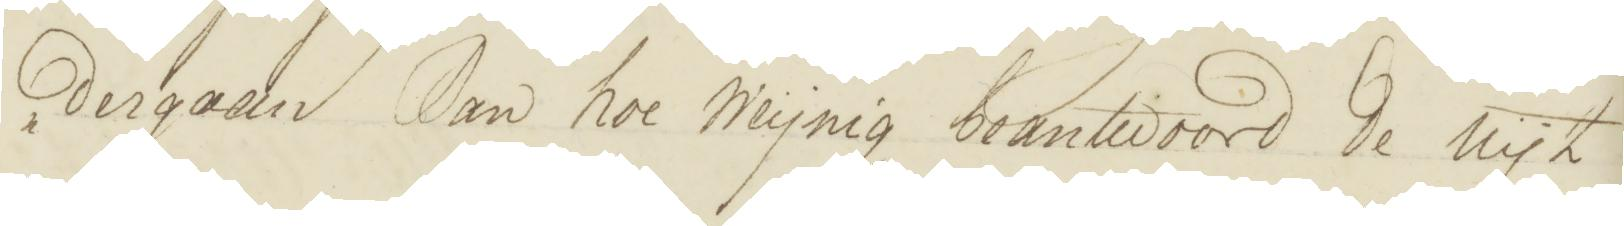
„dergaan dan hoe weijnig beantwoord de uijt
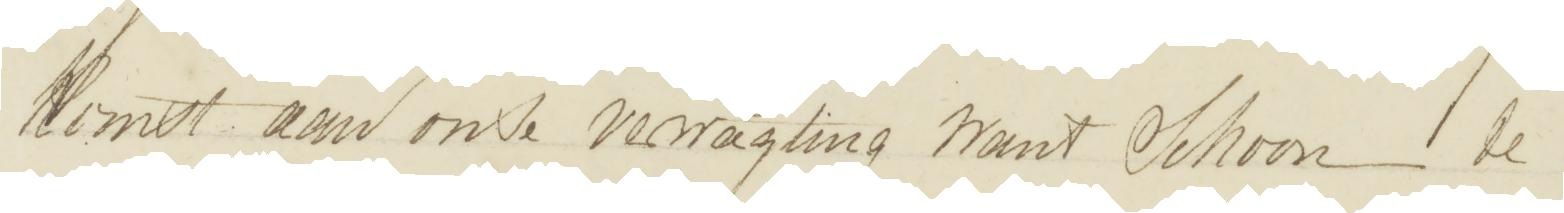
komst aan onse verwagting want schoon de
